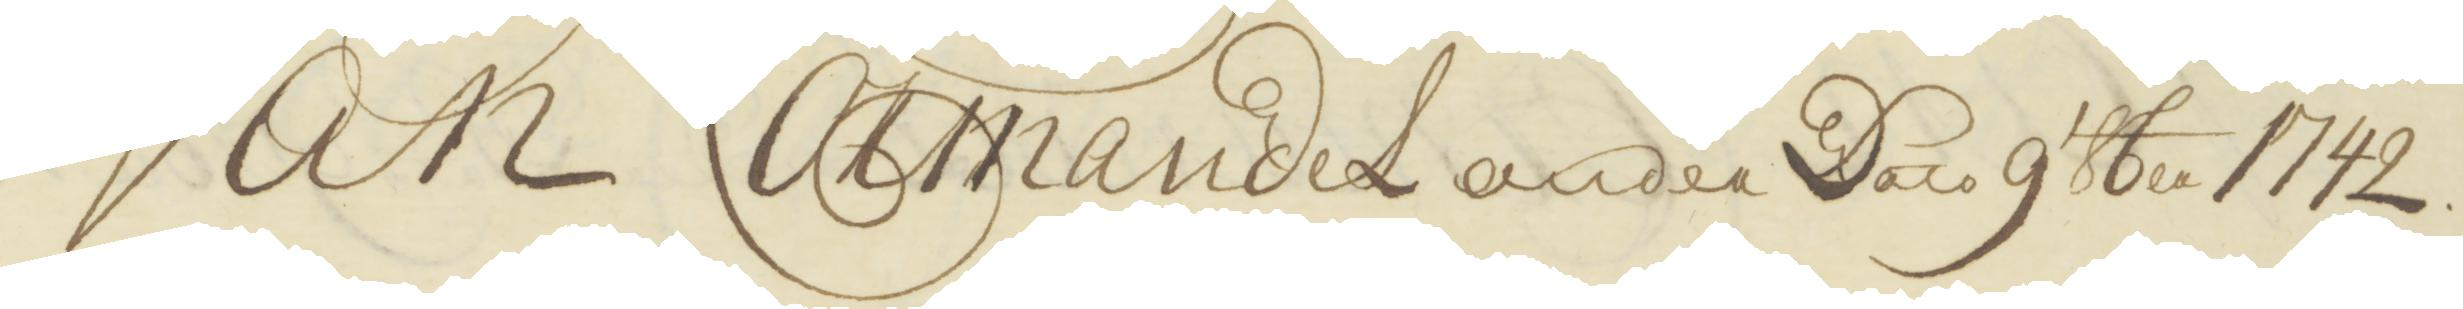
Van Cormandel onder Den 9' 8ber 1742.
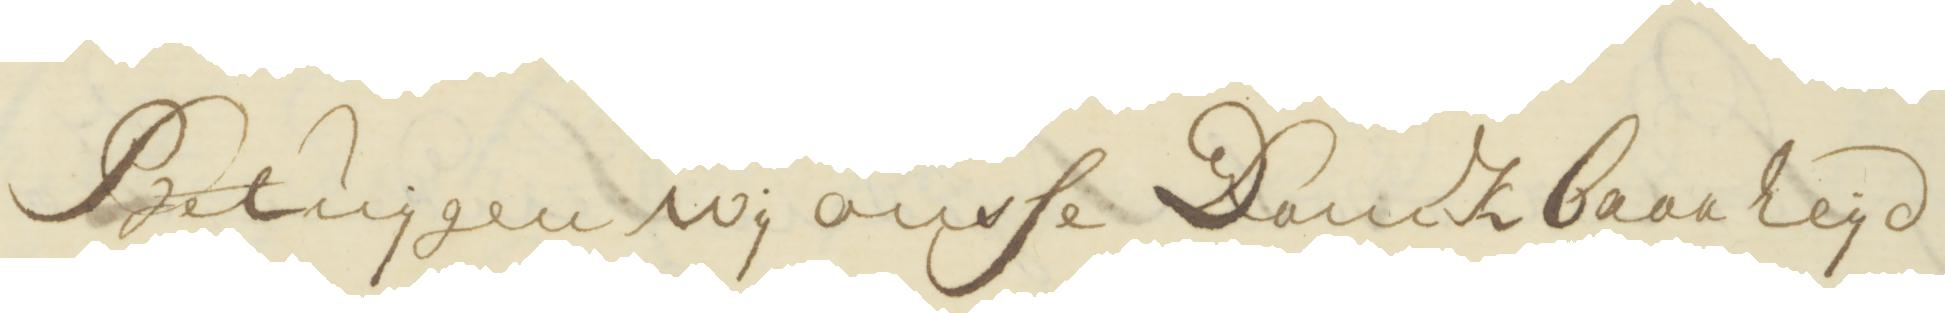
Betuijgen wij onsse Dankbaarheijd
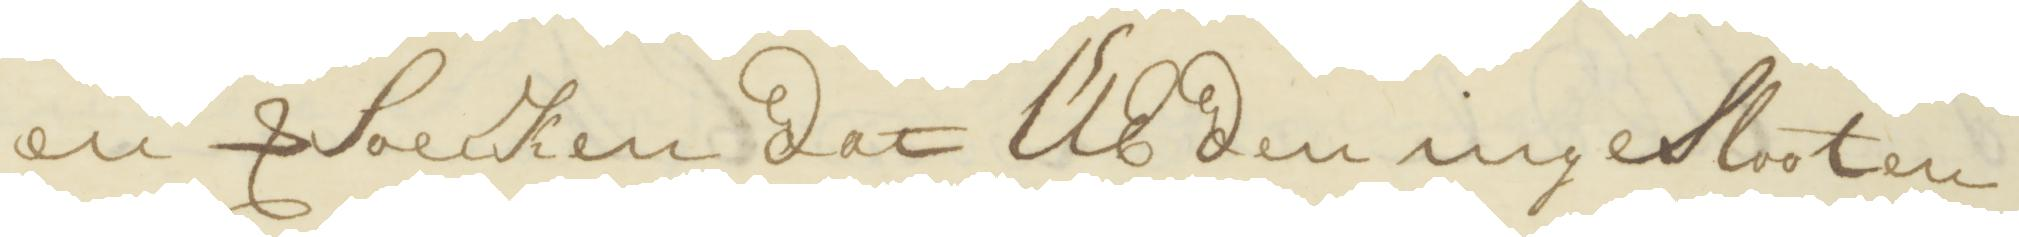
en versoeken dat UE den ingeslooten
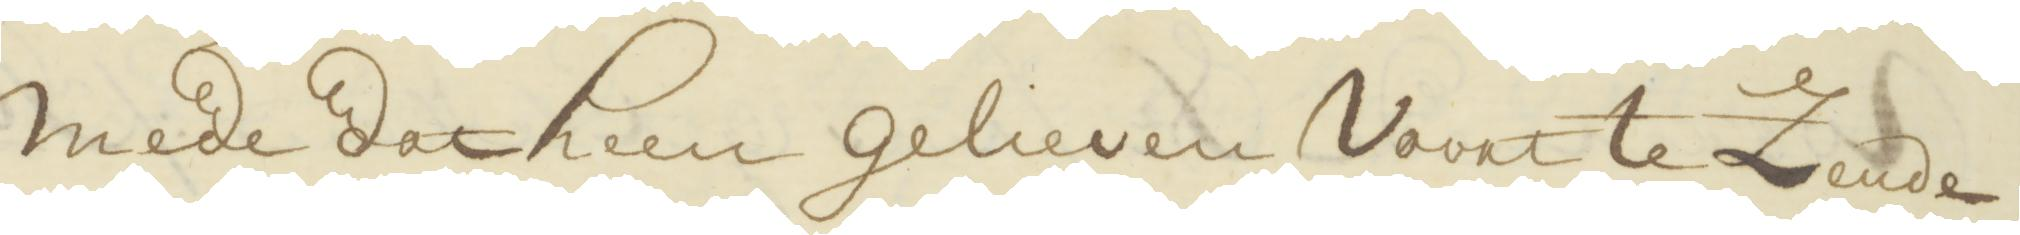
mede dat heen gelieven voort te zende
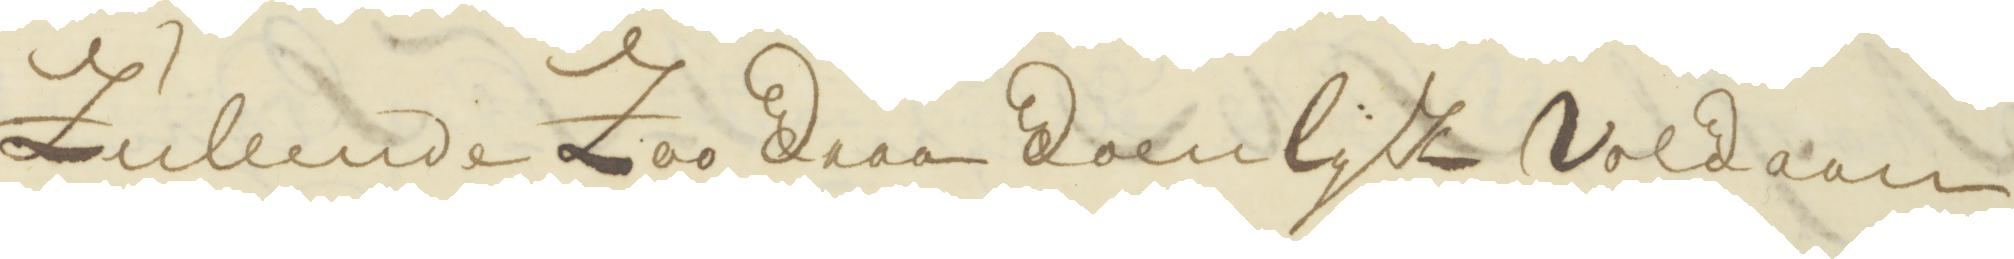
zullende zoo daar doenlijk voldaan
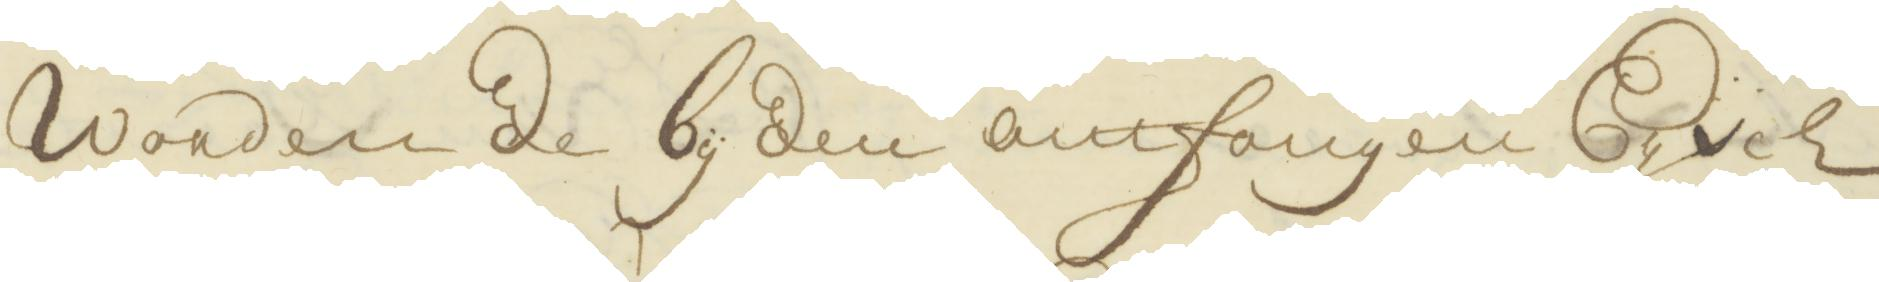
worden de bij den ontfangen Eijsch
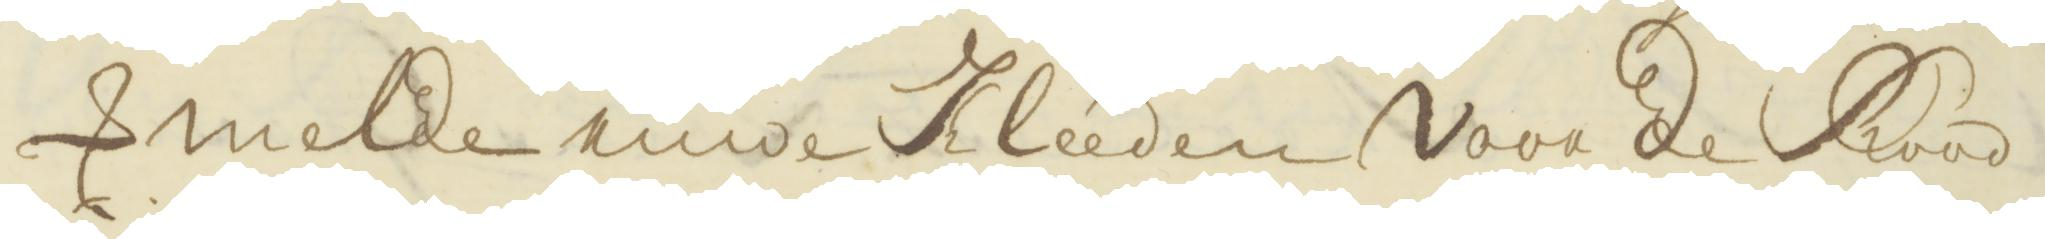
vermelde ruwe kleeden voor de Raad
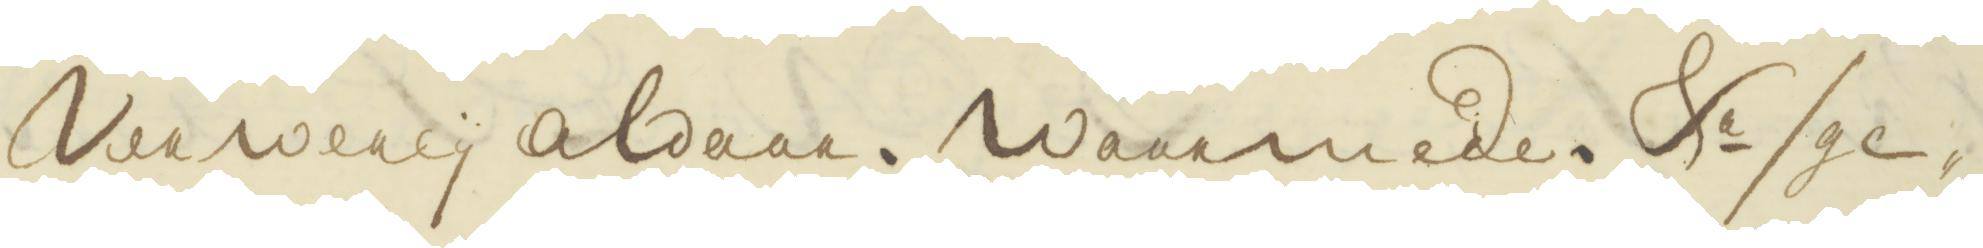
verwereij aldaar waarmede &-a/ge„
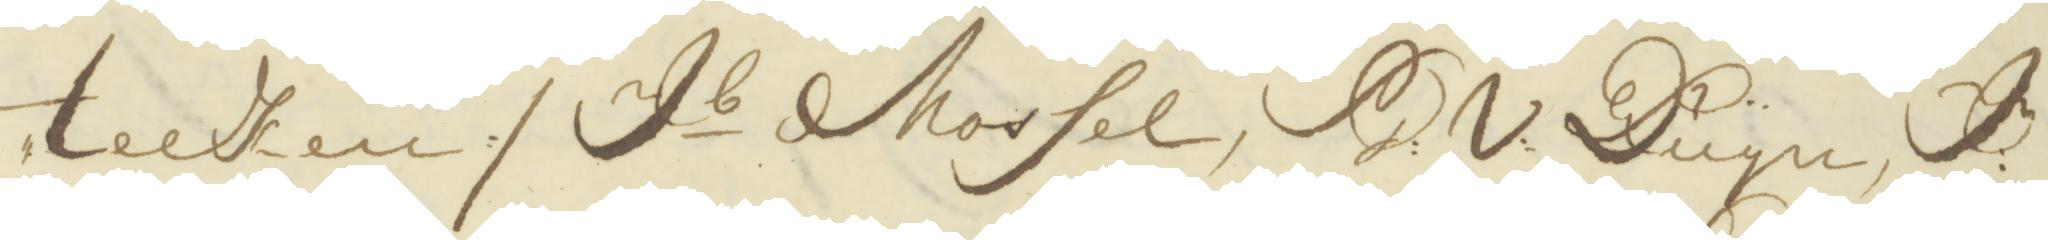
„teeken:/ I=b Mossel, B: V: Duijn, I:n
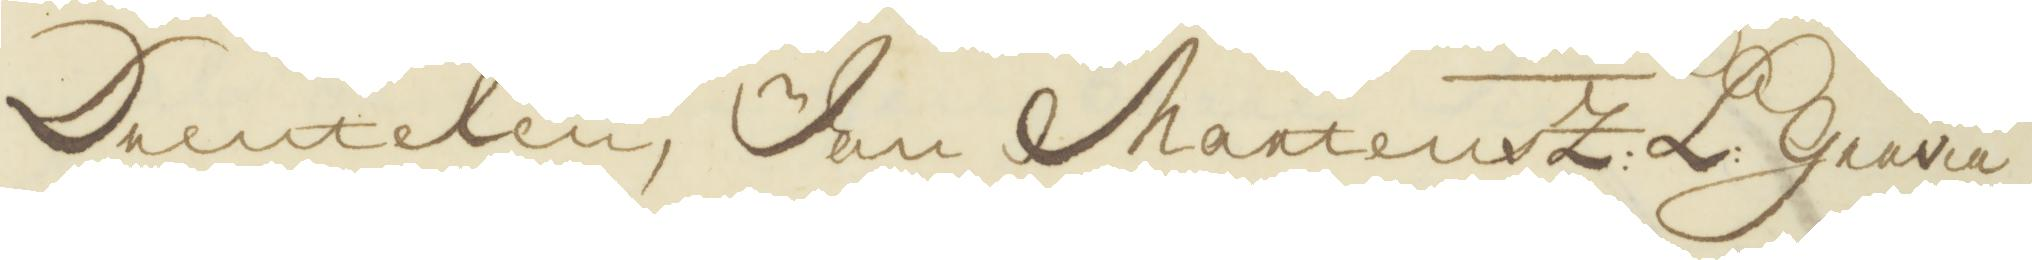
Drentelen, Ian Martensz: L: Gravia
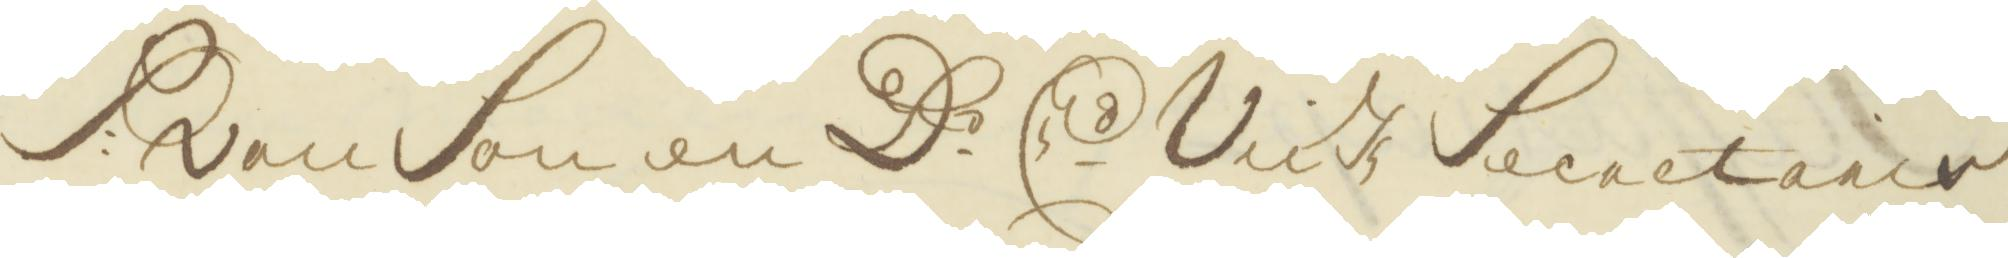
P: van Son en D-d C-de Vick secretaris
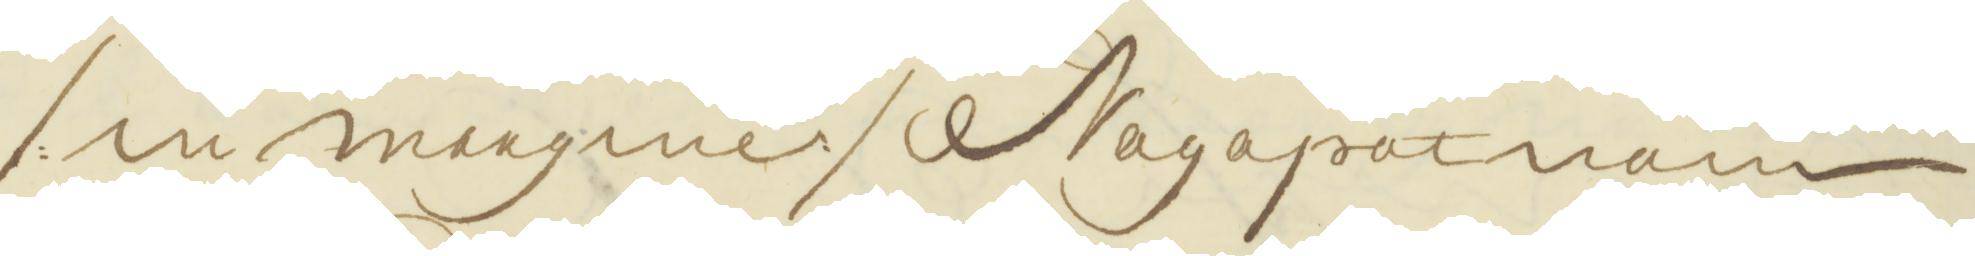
/:in margine:/ Nagapatnam
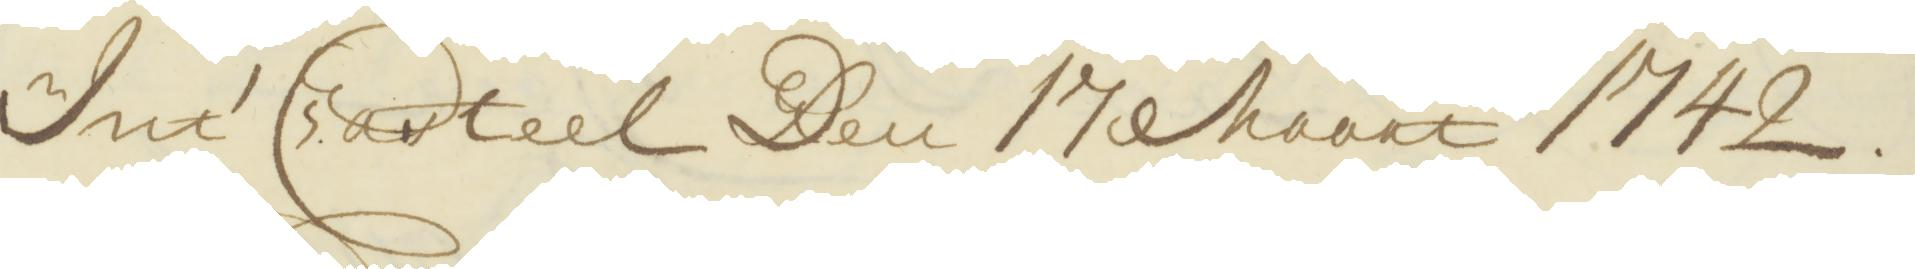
In't Casteel Den 17 Maart 1742.
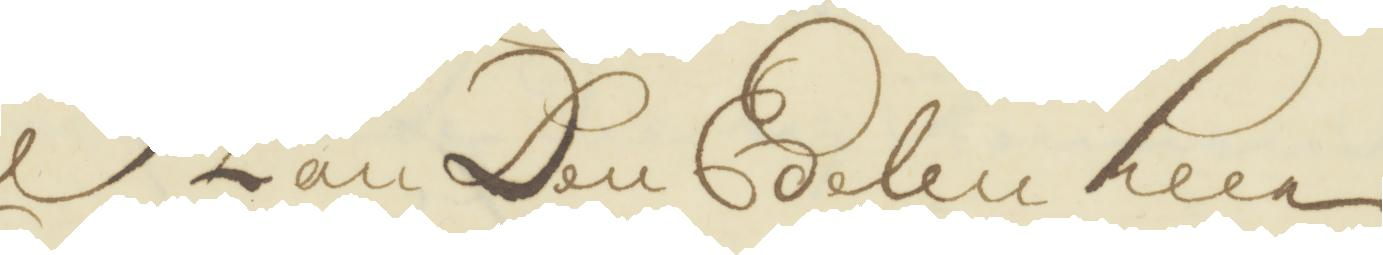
Aan Den Edelen heer
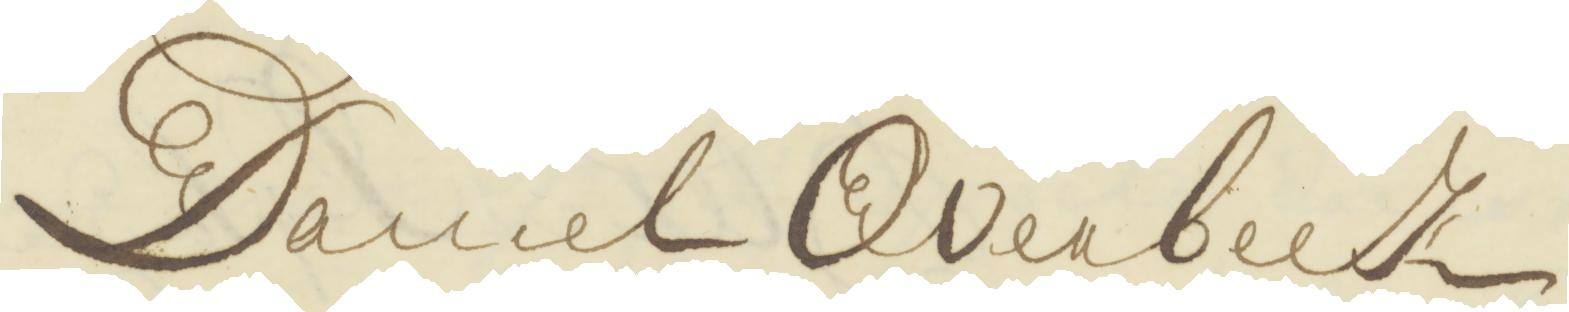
Daniel Overbeek
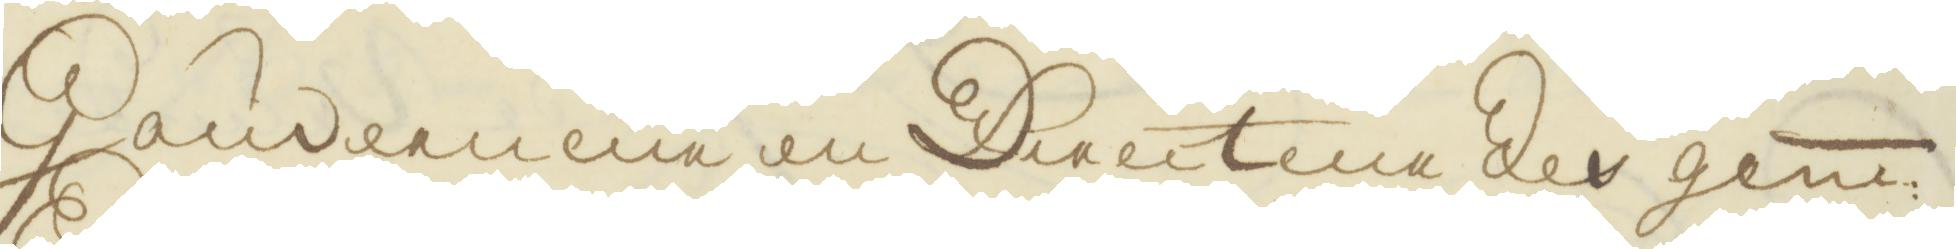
Gouverneur en Directeur des gem:
